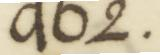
962.
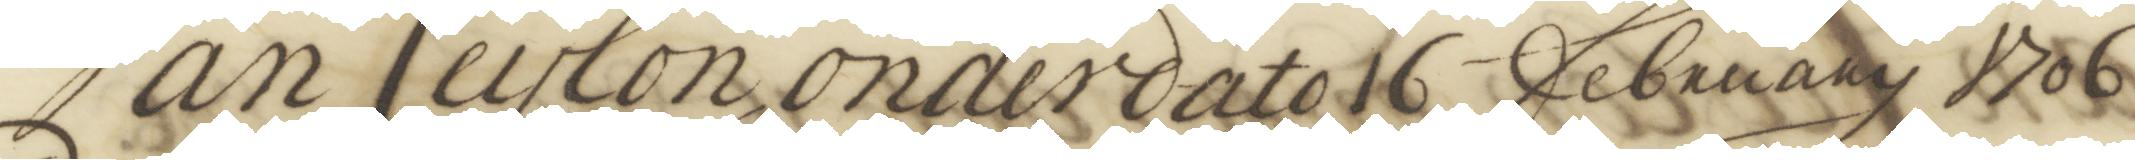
Van Ceylon onder dato 16 february 1706
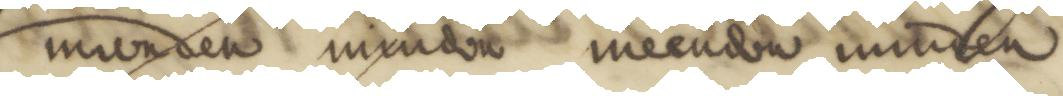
meeder minder meerder minder
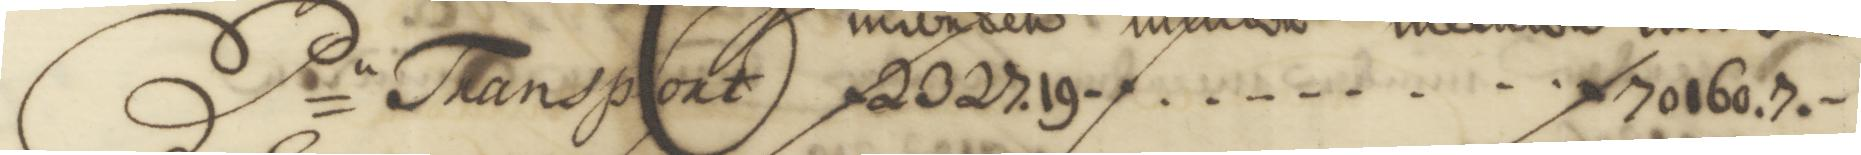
P=r Transport ƒ2327:19- ƒ - - - - - - - - ƒ70160.7.—
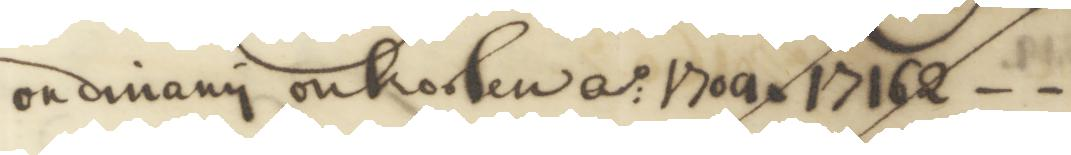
ordinarij onkosten a:o 1704ƒ 17162 — —
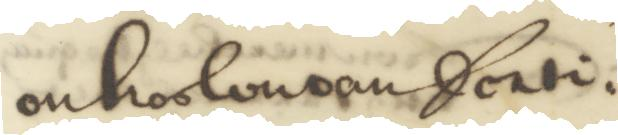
onkostenvanforti„
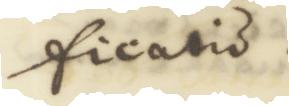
ficatie
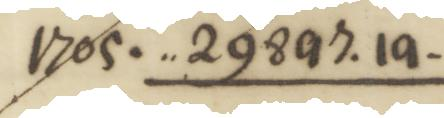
1705. „ 29847.14-
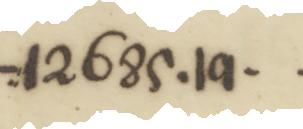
12685.14-
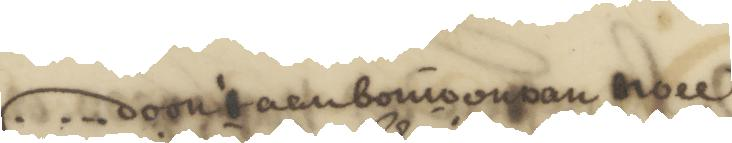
. . - door’t aanbouwen van twee
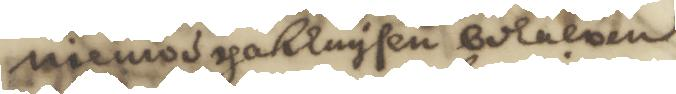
nieuwe pakhuijsen behalven
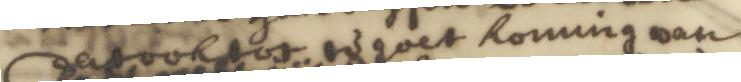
datooktot te goet koming van
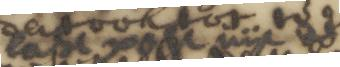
last post uijt de
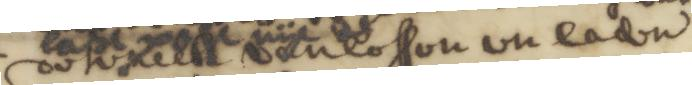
de teveel van lossen en laden
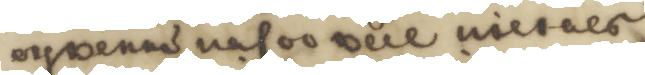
opverre na soo veel niet als
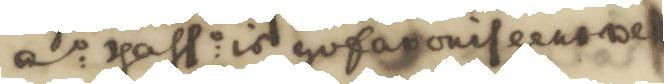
a:o pass:o is gefavoriseert ver
